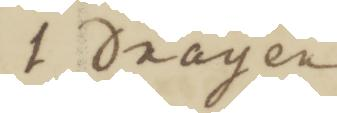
1 drayer
